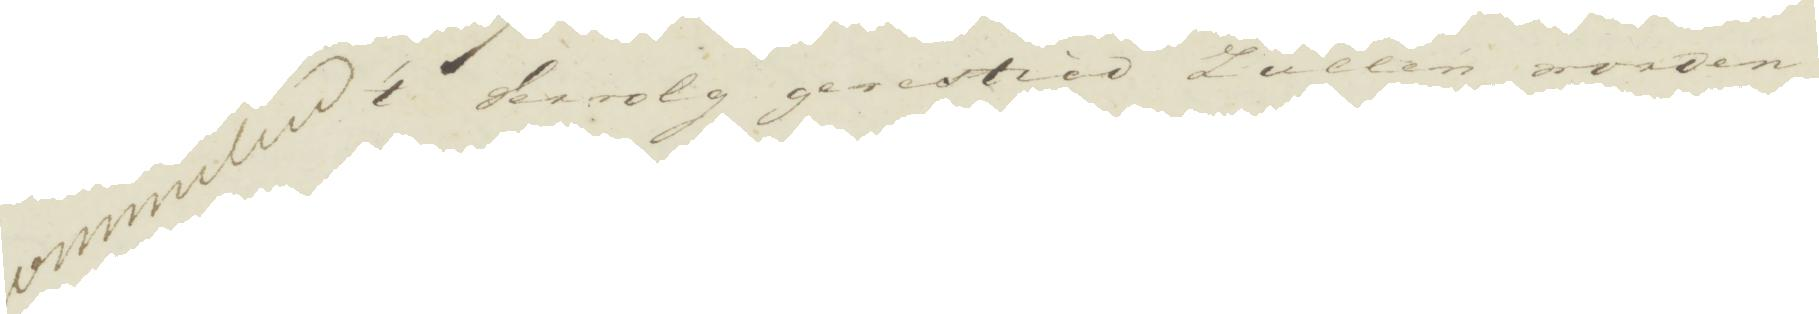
't vervolg gevestigd zullen worden
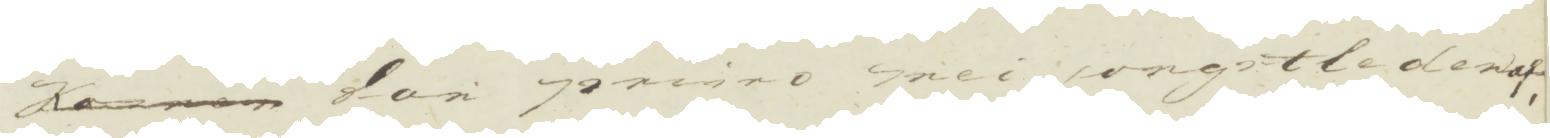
komen van primo mei jongstledene of,
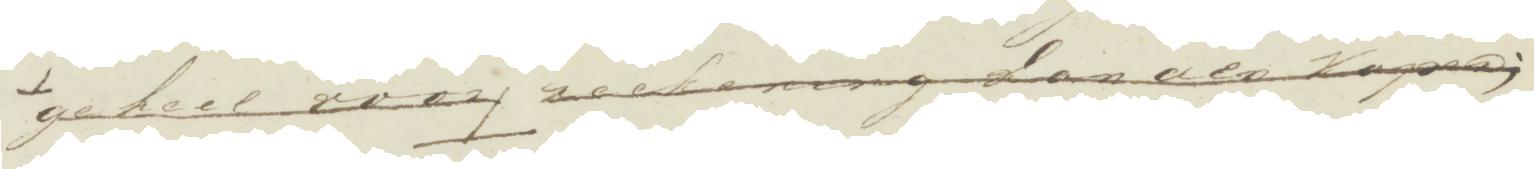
¶geheel oor reekening van den kopers;
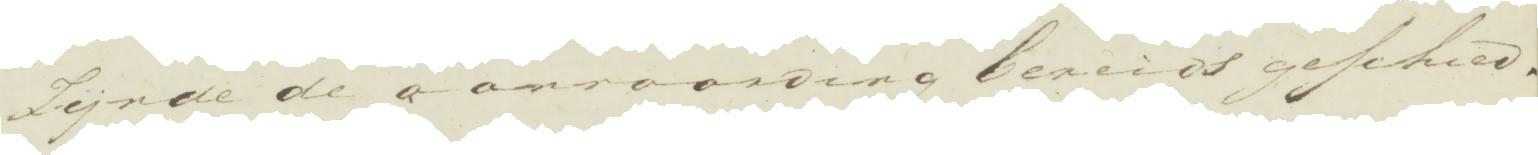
zijnde de aanvoording bereids geschied.
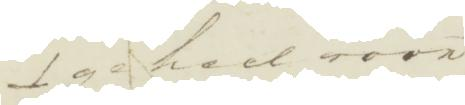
¶ geheel voor
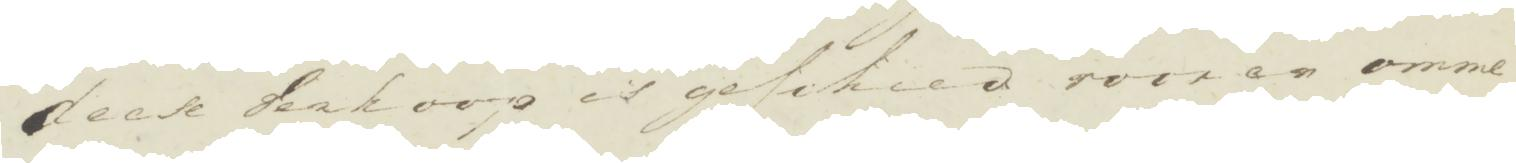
deese verkoop is geschied voor en omme
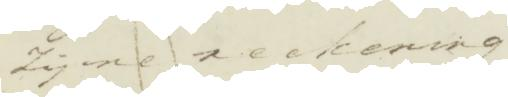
zijne reekening
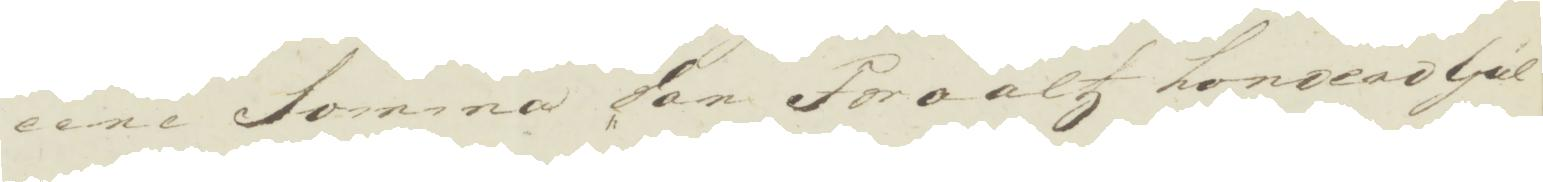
eene somma „van Twaalf honderd Gul
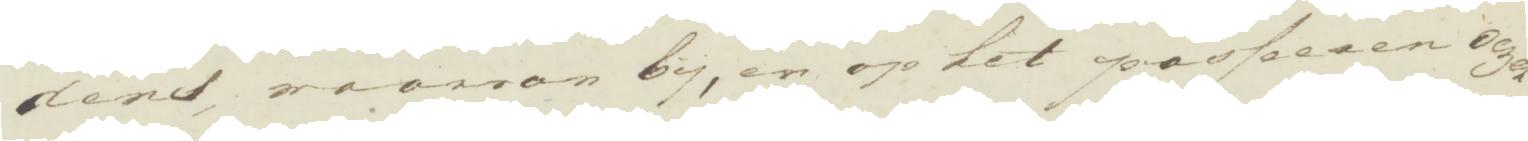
dens, waarvan bij, en op het passeeren dezer
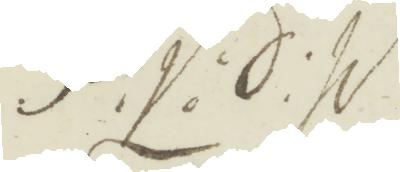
P:V:d:W
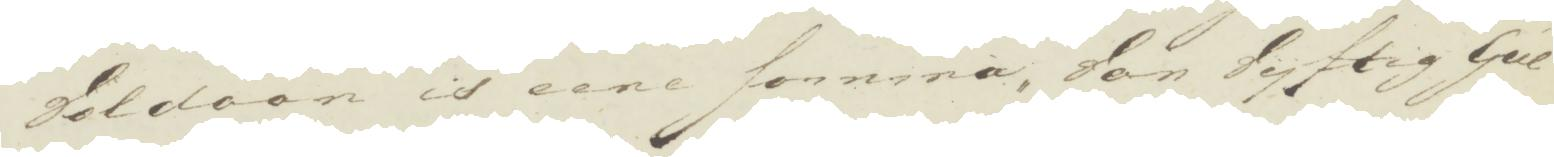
voldaan is eene somma„ van Vijftig Gul
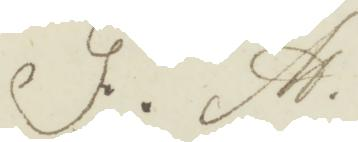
F.M.
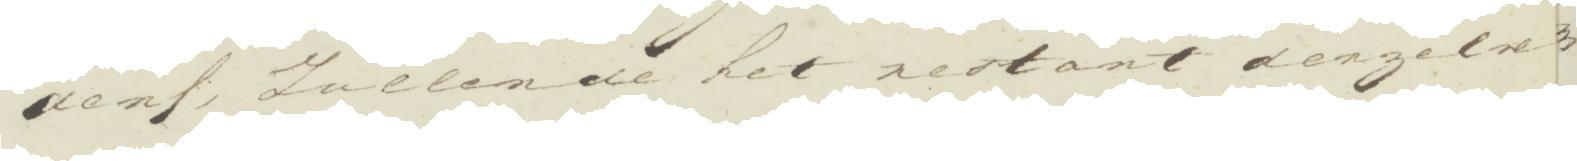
dens, zullende het restant denzelve
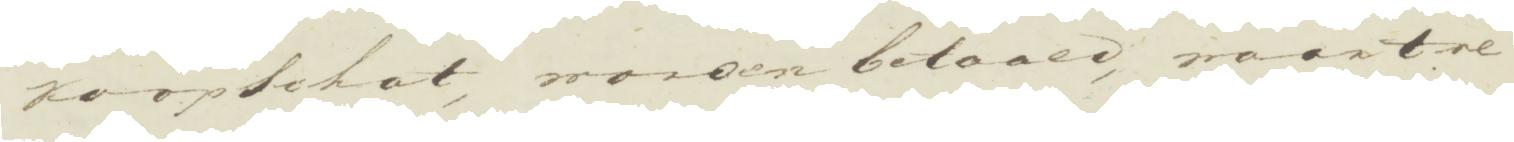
koopschat, worden betaald, waartoe
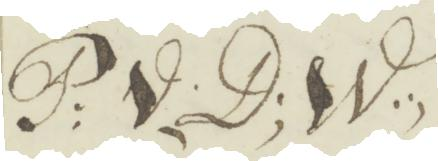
P:V;D;W:,
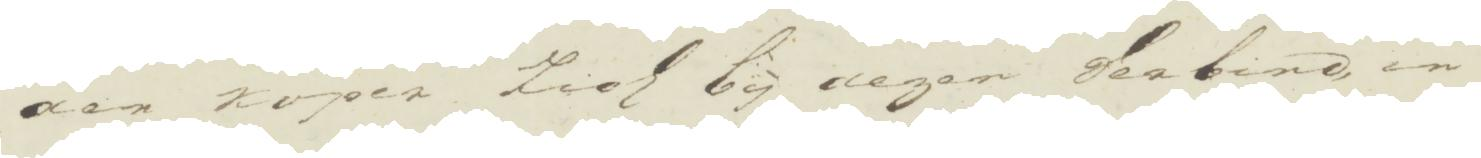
den koper Zich bij dezen verbind in
